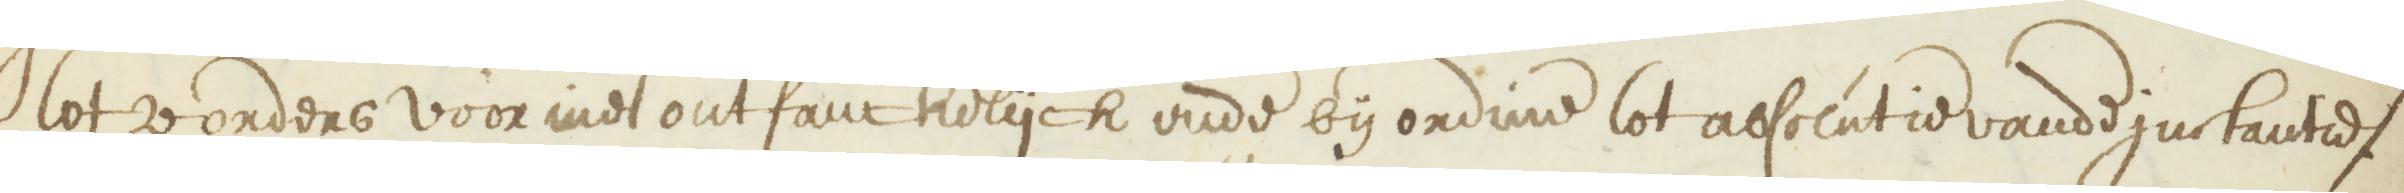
tot vorders voor niet ontfanckelijck ende bij ordine tot absolutie van de jnstantie/.
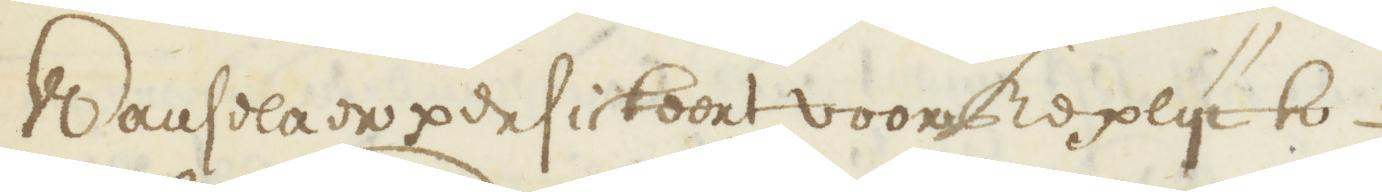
Kanselaer persisteert voor Replijck —
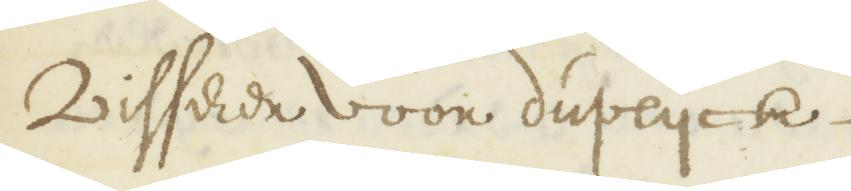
Visscher Voor duplijck —
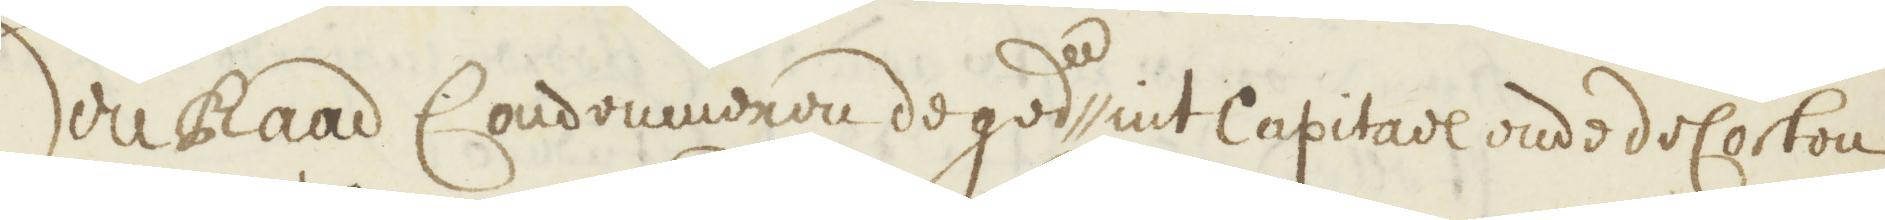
Den Raad Condemneren de ged„ e int Capitael ende de Costen
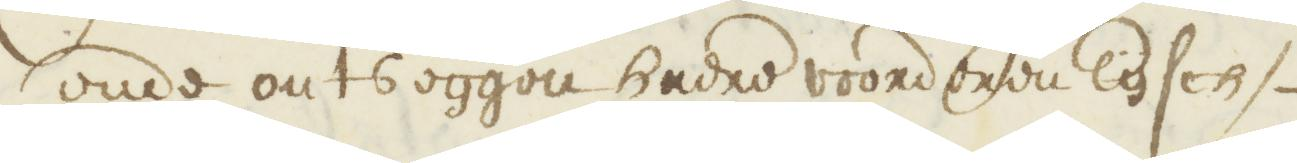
ende ontseggen haere voorderen Eijsch / —
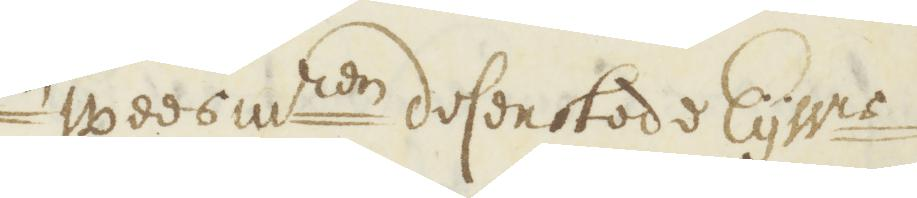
D H=ren weesm=ren deserstede Eijss=rs
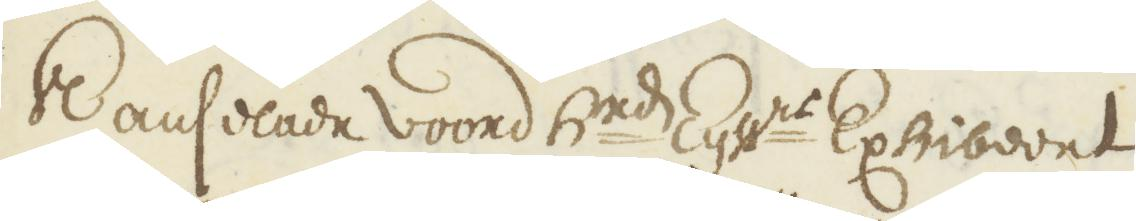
Kanselaer voord H=ren Eyss=rs Exhibeert
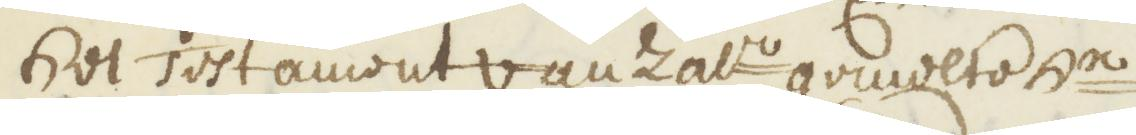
Het Testament van zal=r gemelte h=r
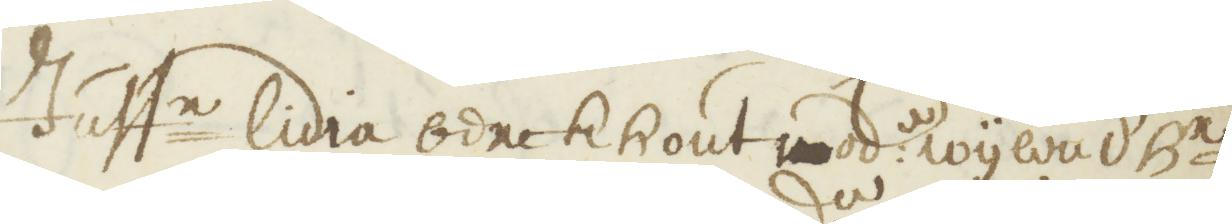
Iuff=r lidia berckhout wed:e wijlen d' H=r
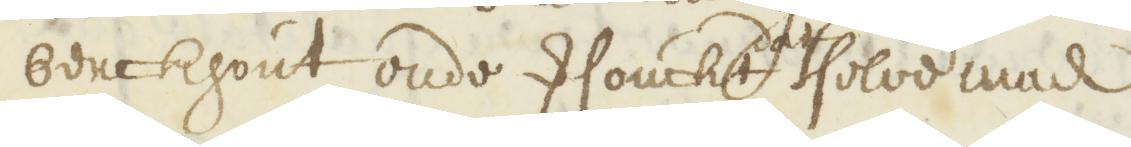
berckhout ende versouckt dat tselve mae
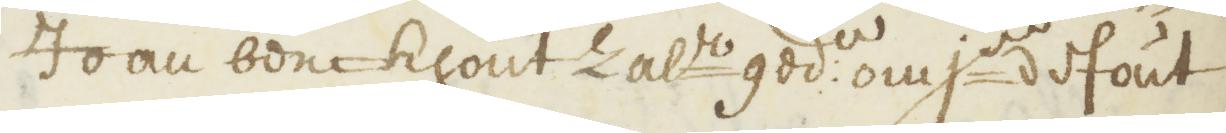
Ioan berckhout zal=r ged:e om j=e defout
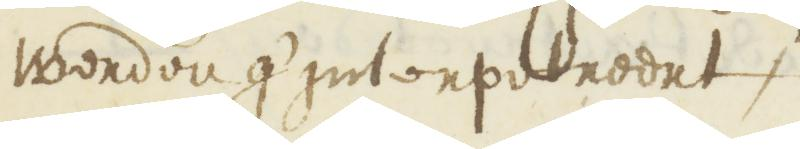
werden g’jnterpetreert/
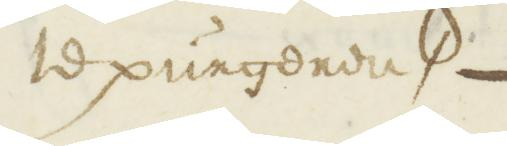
te purgeren / —
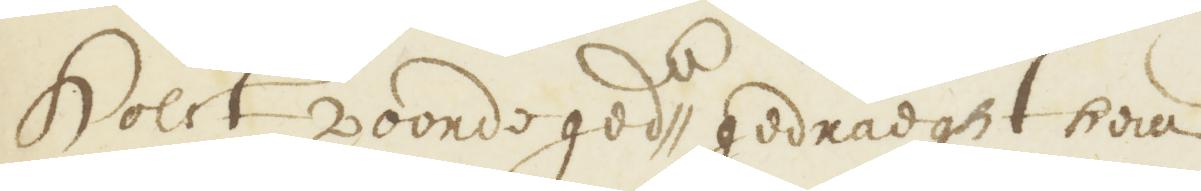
Holst voorde ged„e gedraeght hem
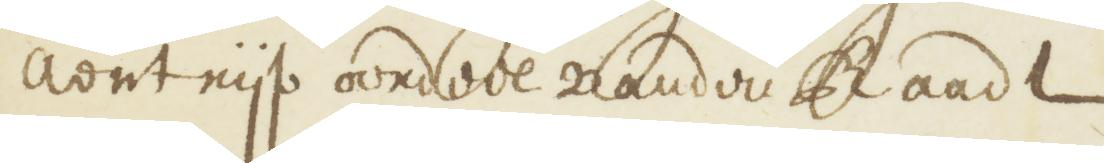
aent rijp oordeel vanden Raadt
